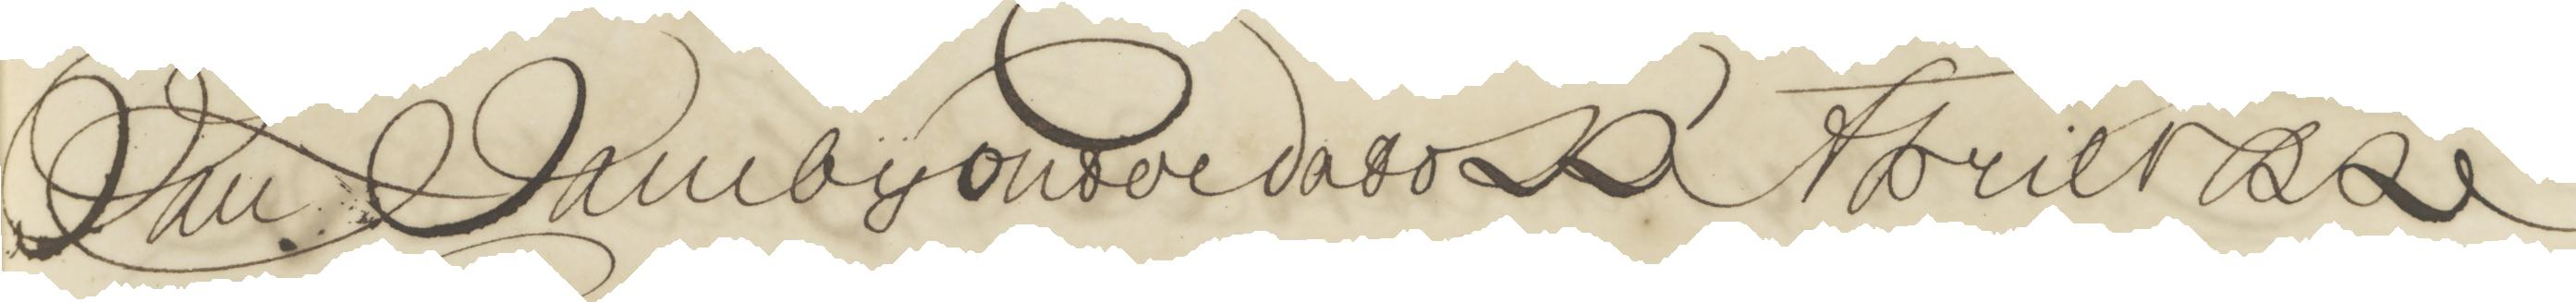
Van Iambij onder dato 22' April 1722
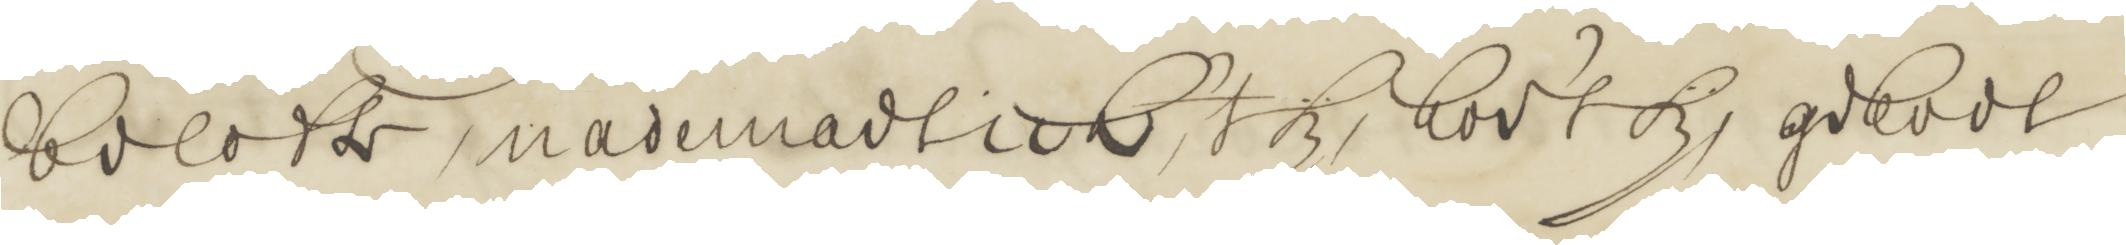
belofte, nademaelick, t Sij, hoe't Sij, geheel
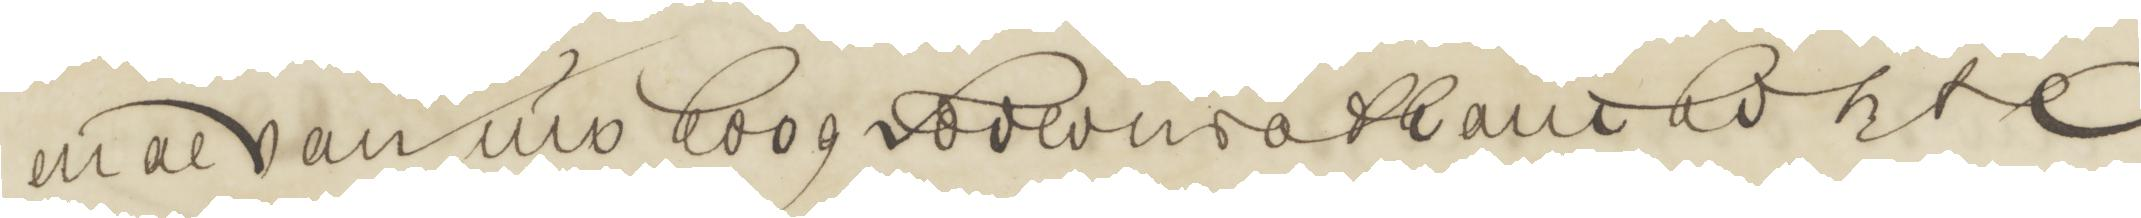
en al van uw hoog Edelens afhanckelijk
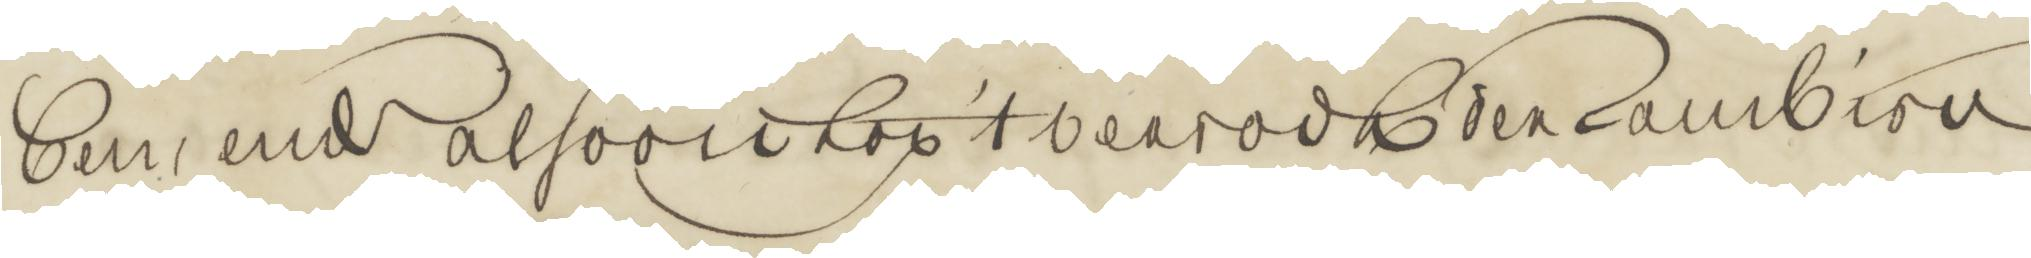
ben, ende alsoo ick op ’t versoek der Iambise
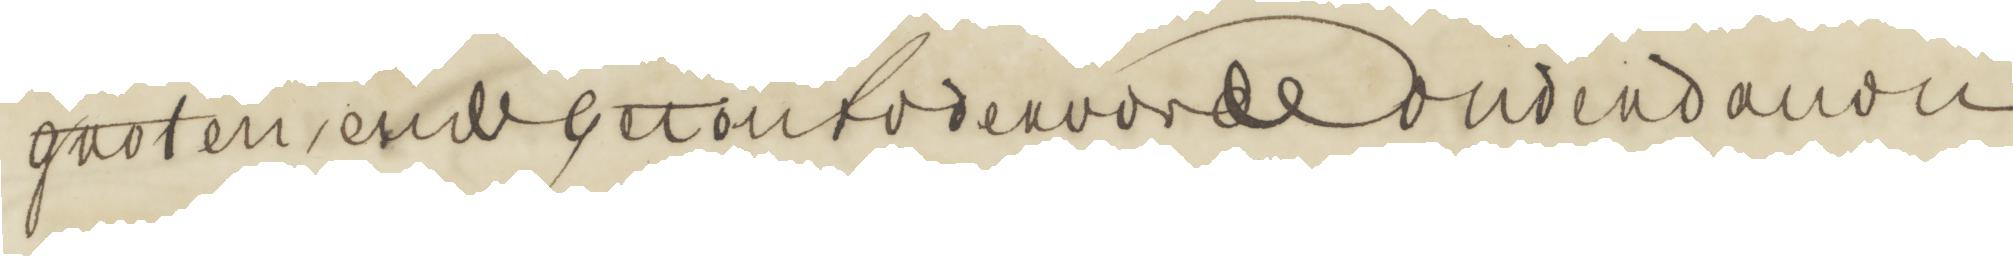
groten, ende geconfedereerde onderdanen
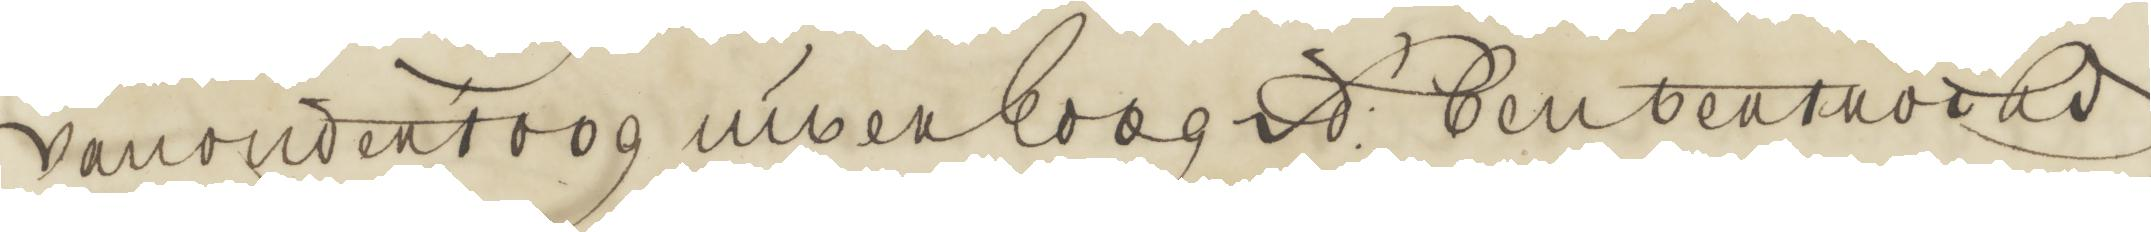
van onder 't oog uwer hoog Ed:' ben vertrocken,
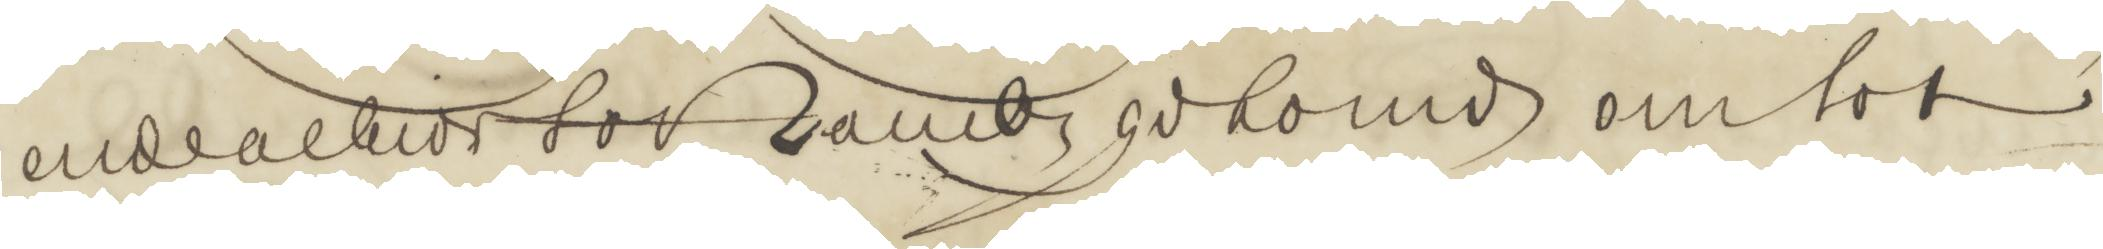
ende alhier tot Iamby gekomen om tot
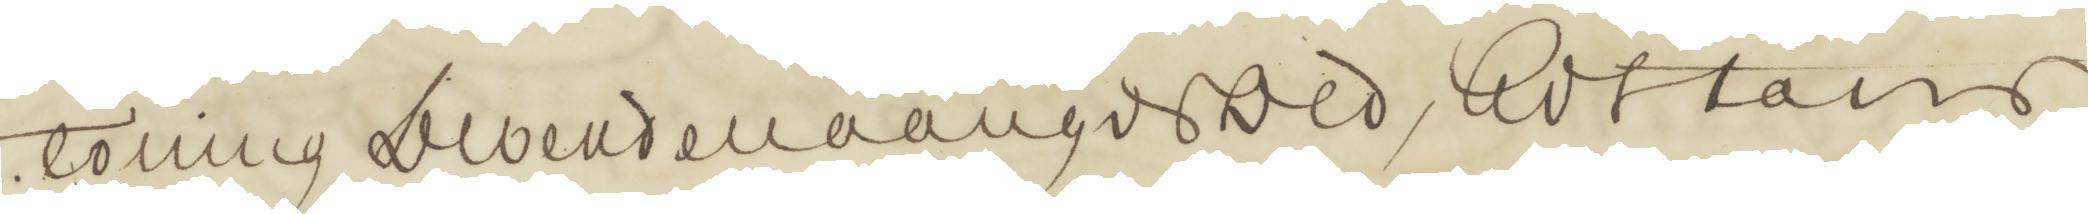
coning te werden aangesteld, het tans
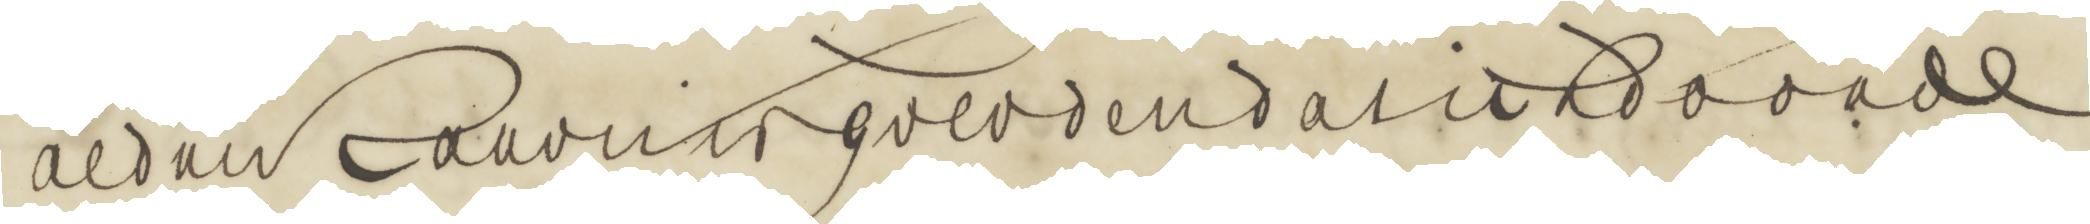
al drie Iaren is geleden dat ick doorde
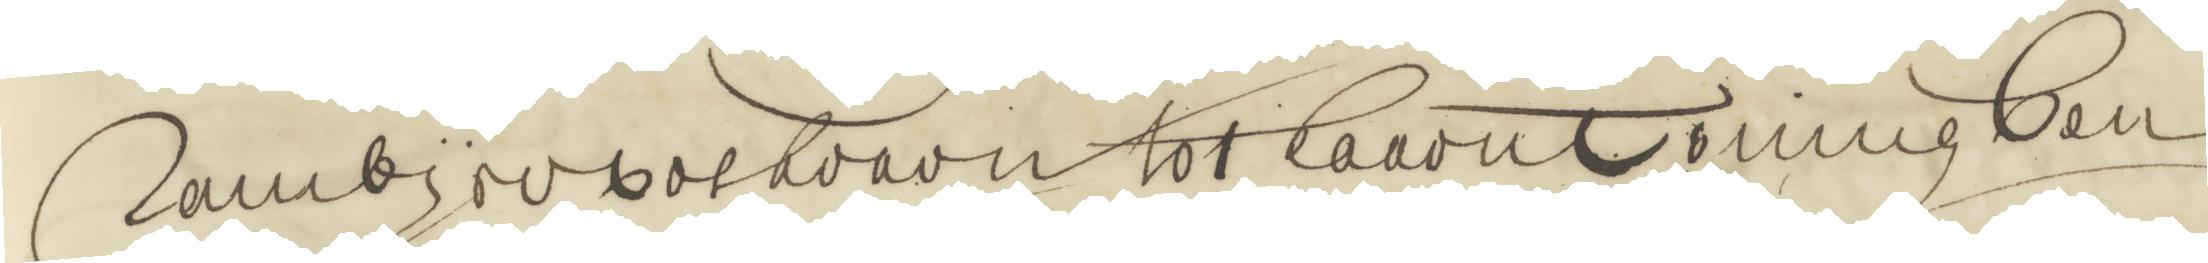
Iambijse volkeren tot haren Coning ben
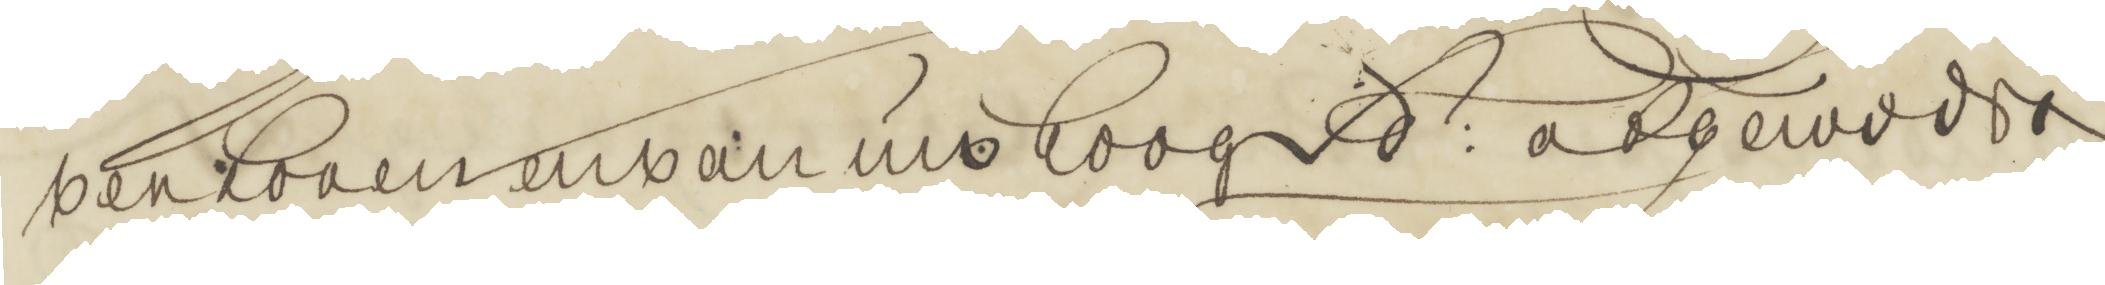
verkoren en van uw hoog Ed:s afgeweest
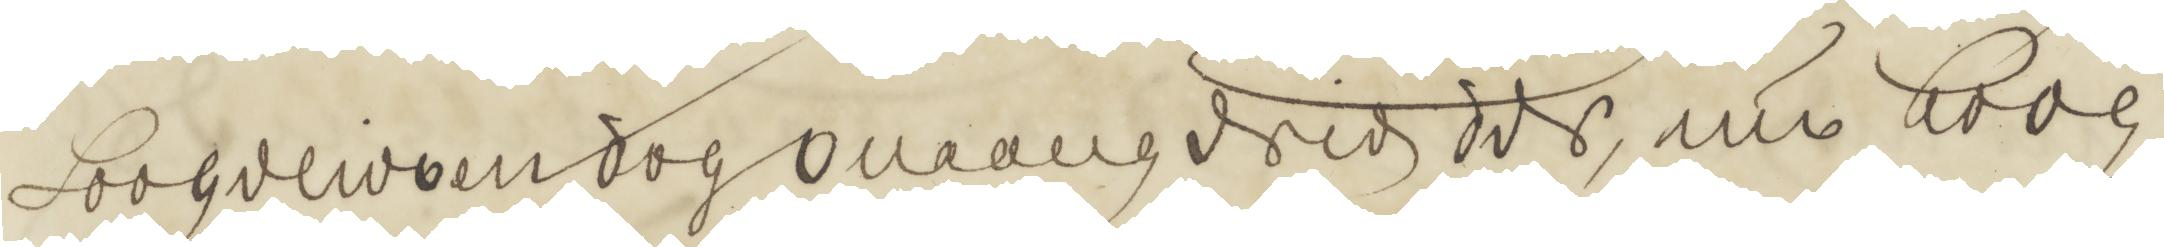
Soo gelieven dog onangesien des, uw hoog
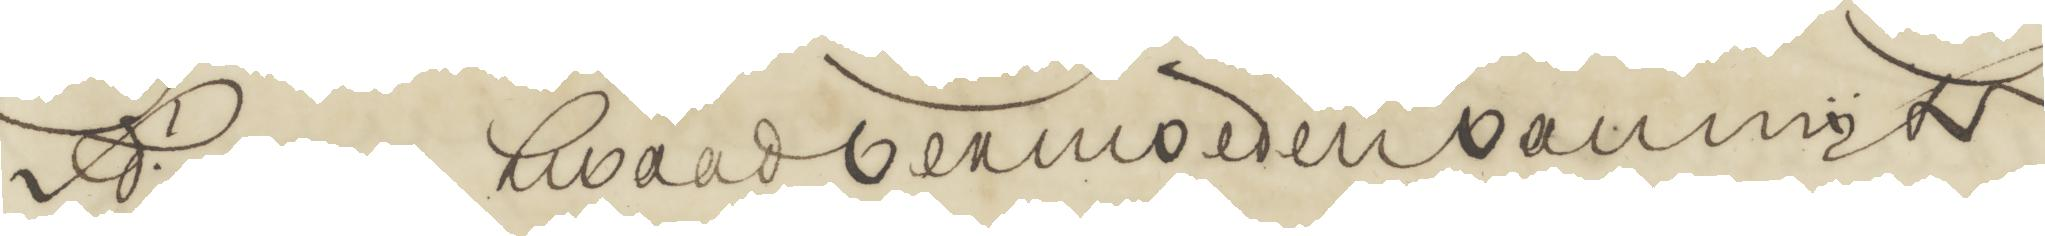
Ed:s geen kwaad vermoeden van mij te
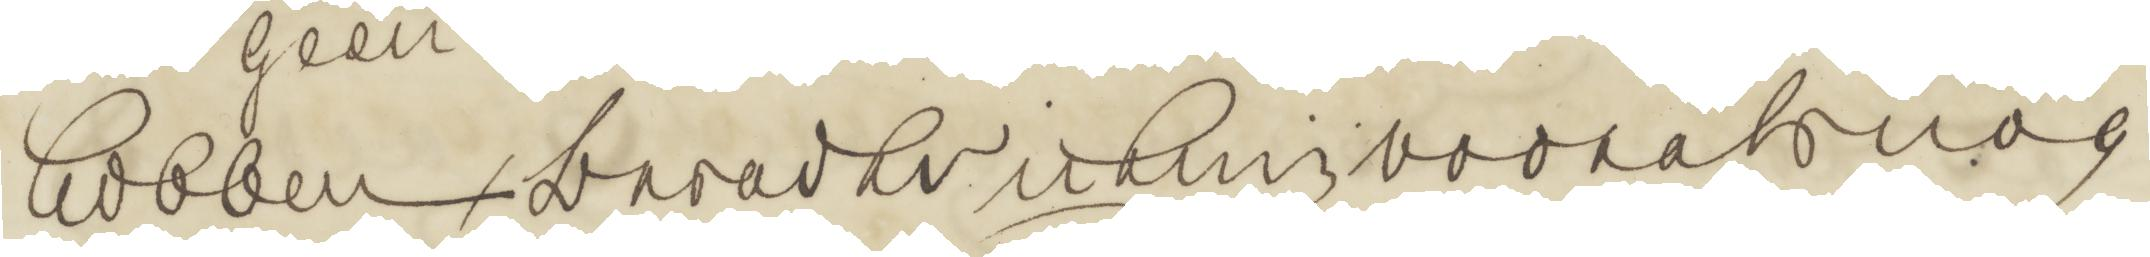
hebben tersaeke ick mij voor als nog
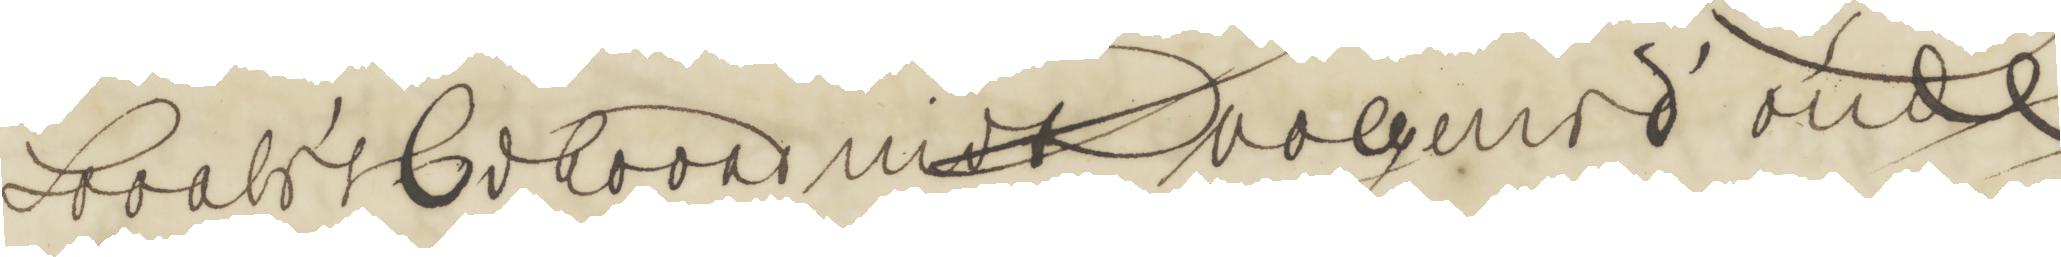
Soo als 't behoort niet volgens d’ oude
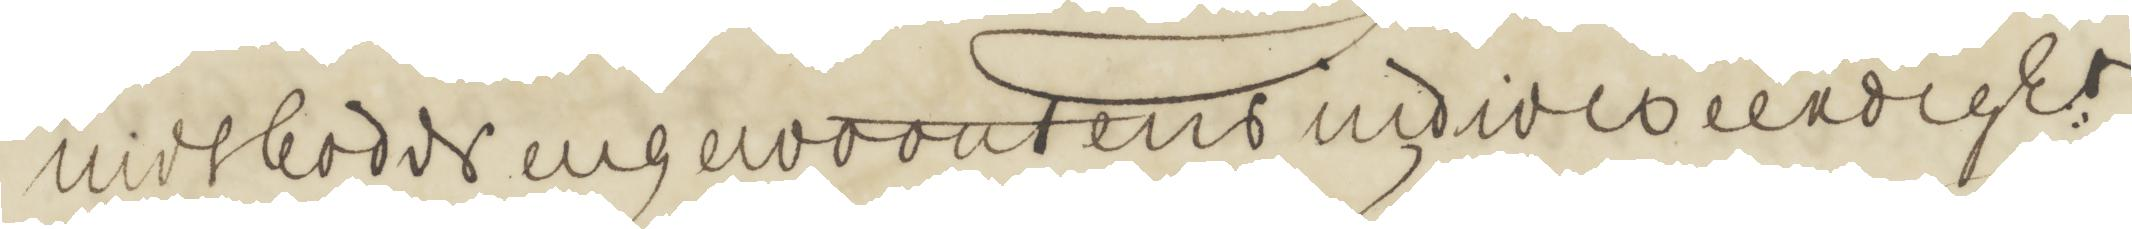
methodes en gewoontens in die weerdigh:t
